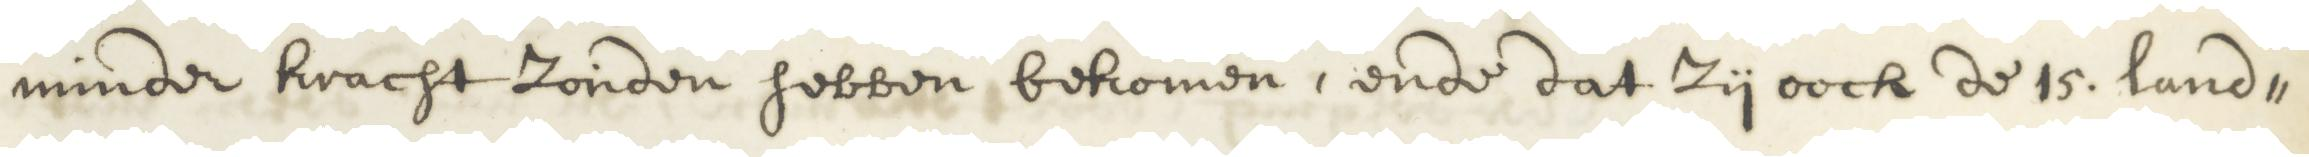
minder kracht zouden hebben bekomen, ende dat zij oock de 15. land„
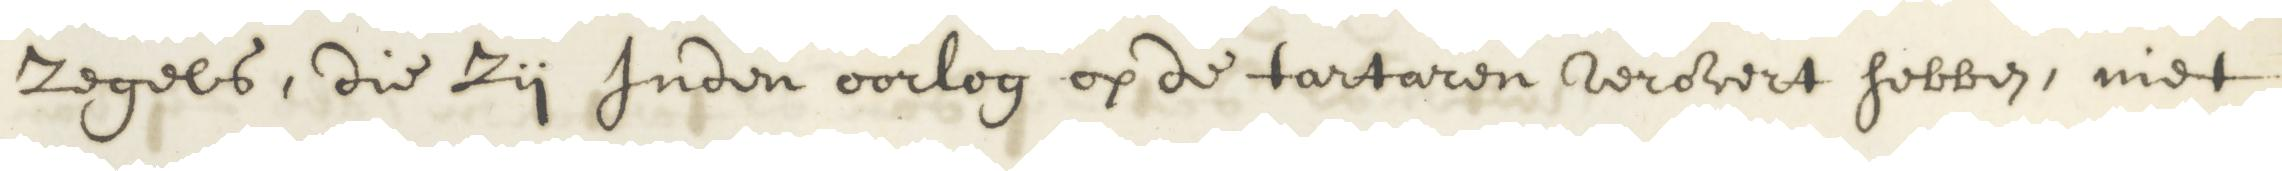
zegels, die zij Jnden oorlog op de tartaren verovert hebben, niet
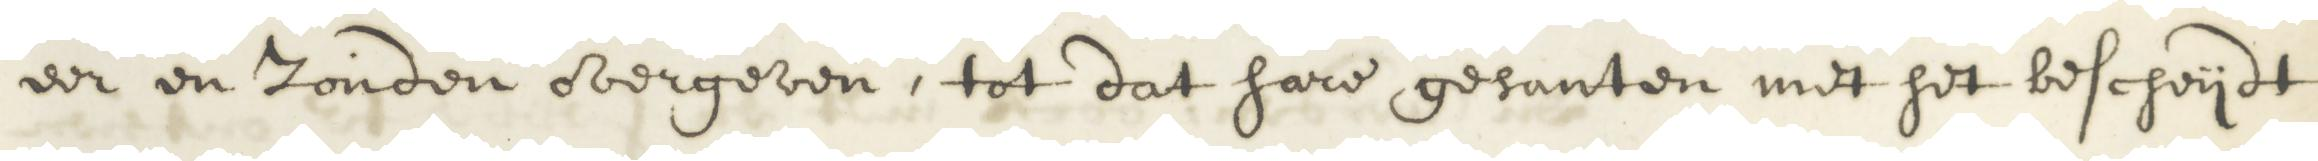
eer en zouden overgeven, tot dat hare gesanten met het bescheijdt
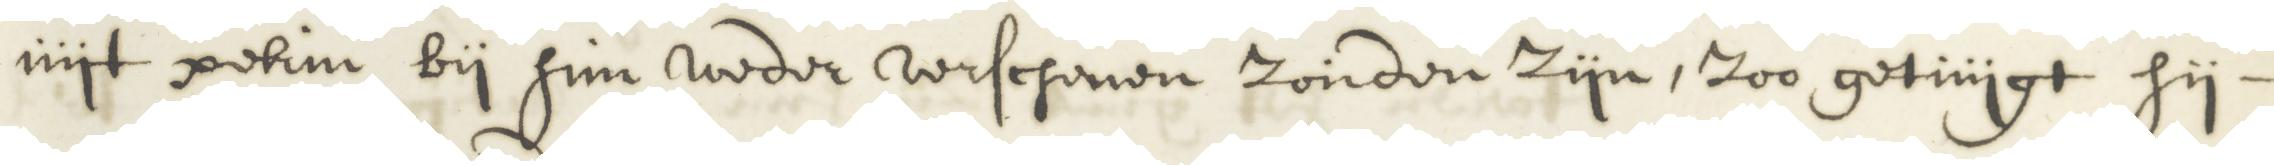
uijt pekin bij hun weder verschenen zouden zijn, zoo getuijgt hij
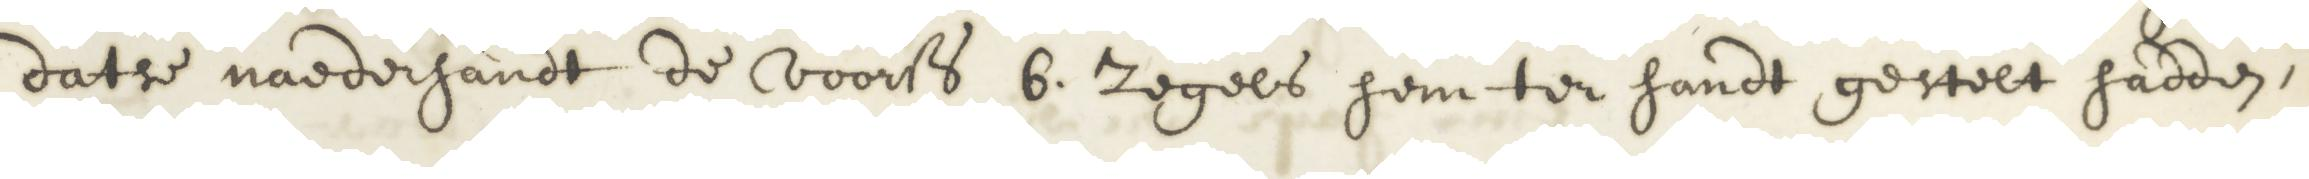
datse naederhandt de voors 6. zegels hem ter handt gestelt hadden,
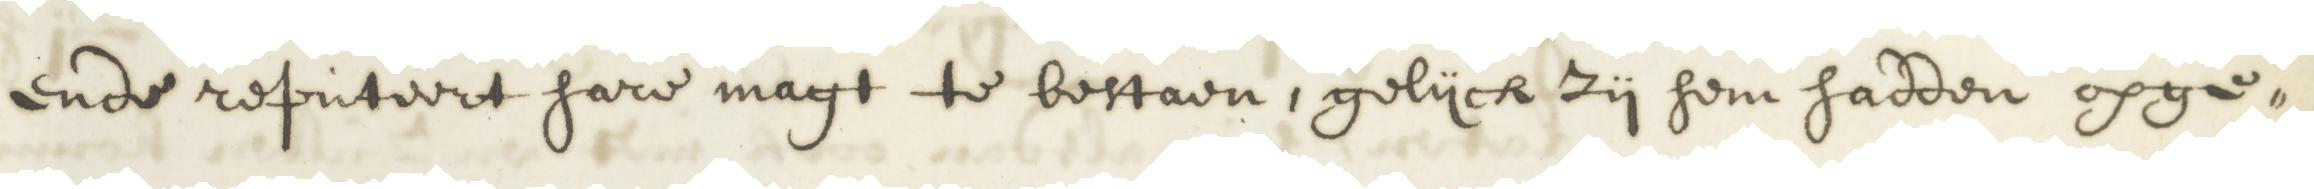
ende reputeert hare magt te bestaen, gelijck zij hem hadden opge„
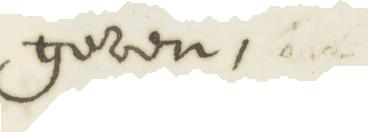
geven,
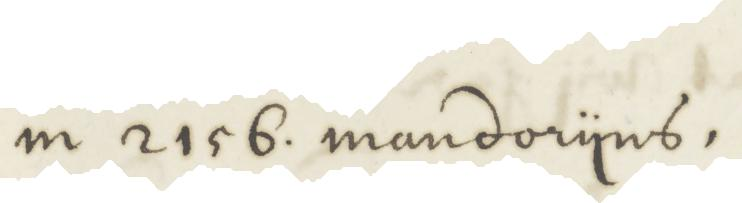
in 2156. mandorijns,
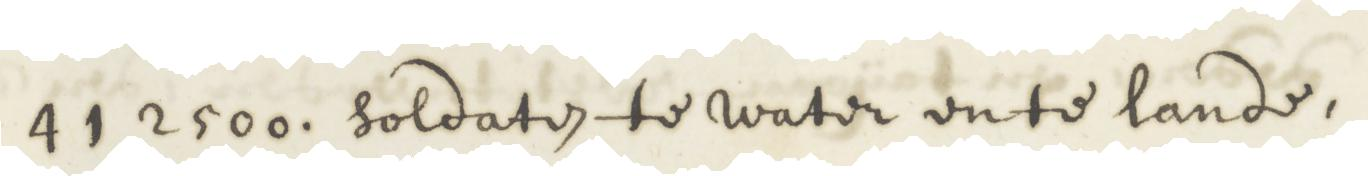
412500. soldaten te water en te lande,
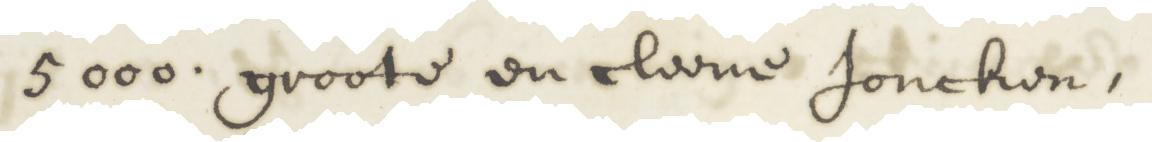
5000. groote en cleene Joncken,
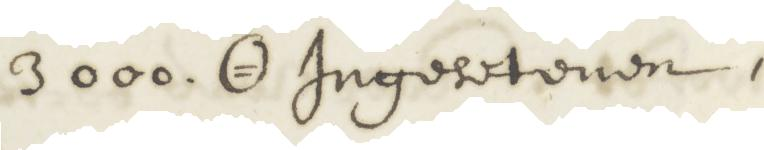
3000. (=) Jngesetenen,
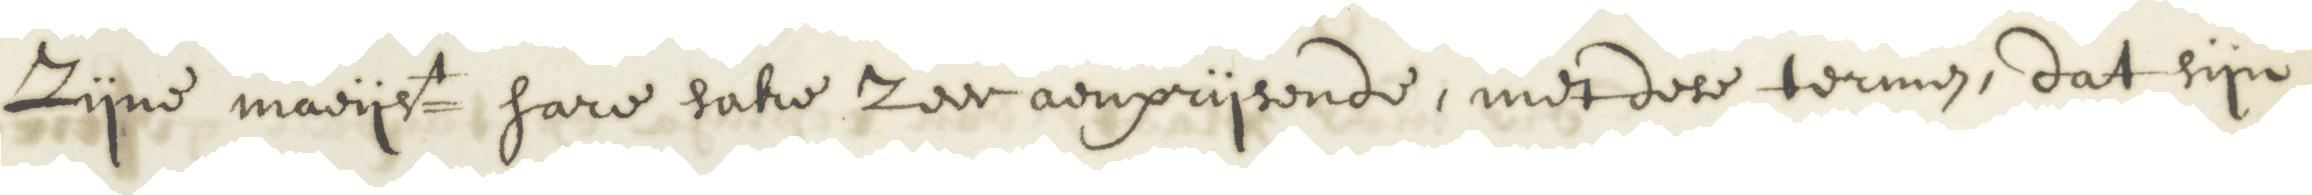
Zijne maeijs=t hare sake zeer aenprijsende, met dese termen, dat sijn
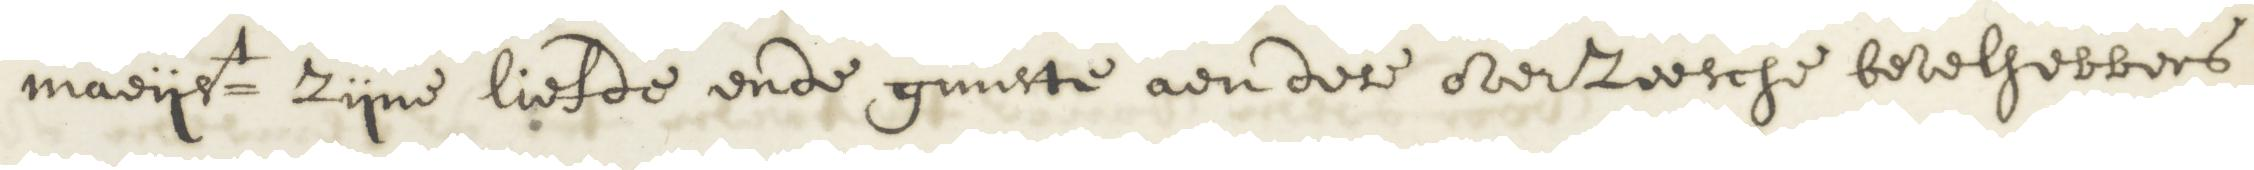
maeijs=t zijne liefde ende gunste aen dese overzeesche bevelhebbers
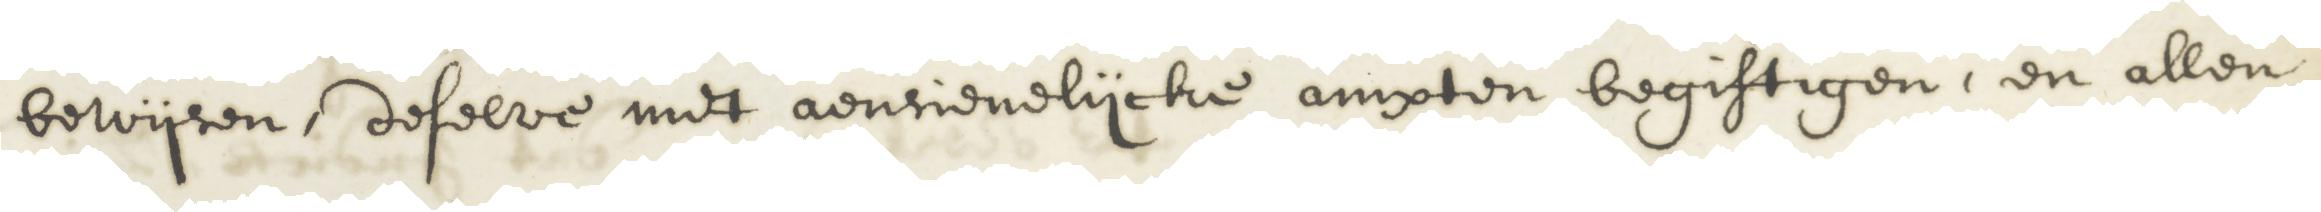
bewijsen, deselve met aensienelijcke ampten begiftigen, en allen
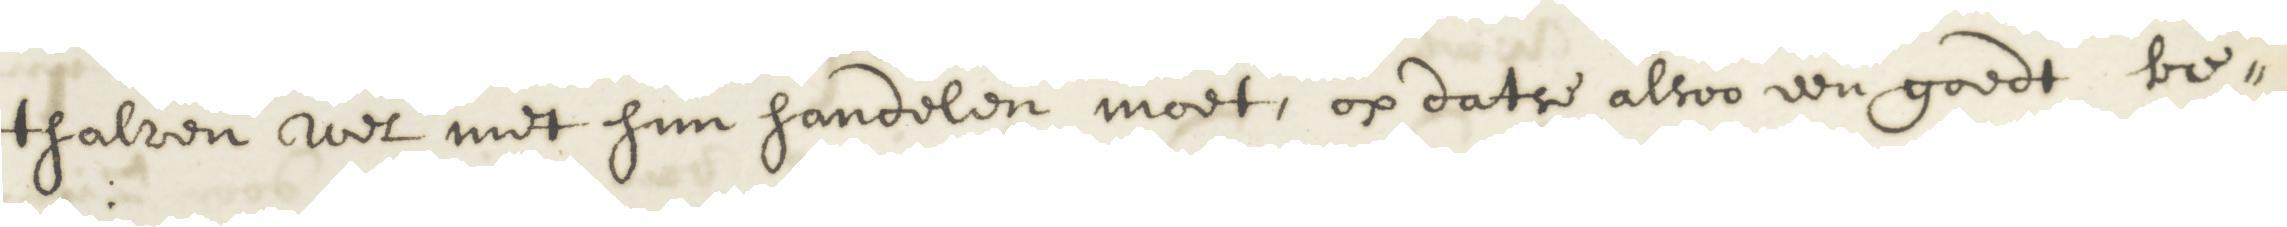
thalven wel met hun handelen moet, op datse alsoo een goedt be„
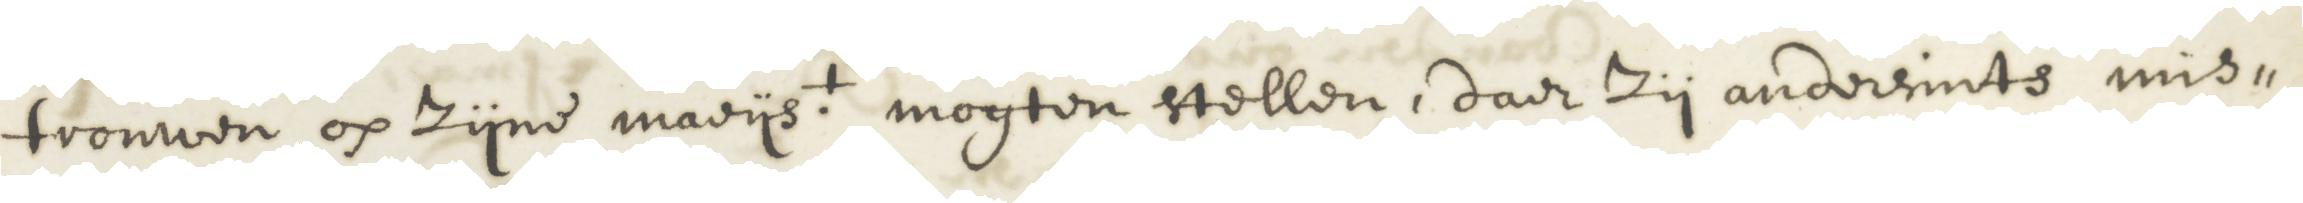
trouwen op zijne maeijs.t mogten stellen, daer zij andersints mis„
